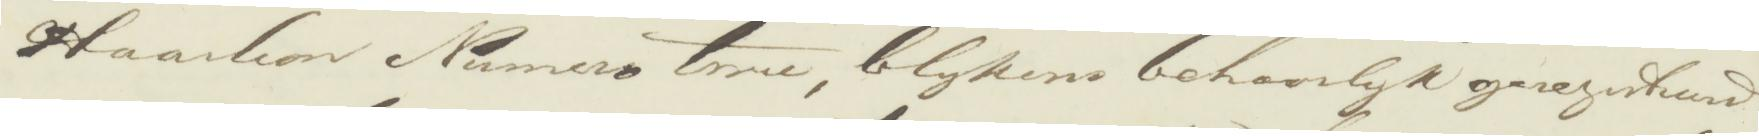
Haarlem Numero twee, blykens behoorlyk geregistreerd
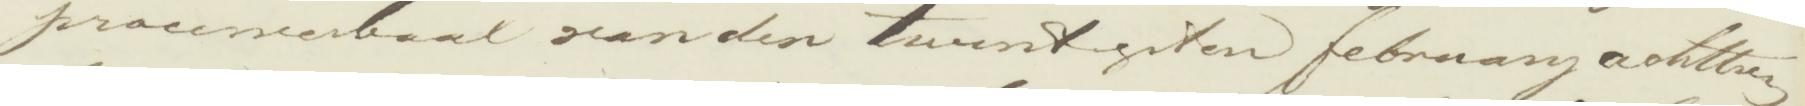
procesverbaal van den twintigsten february achttien
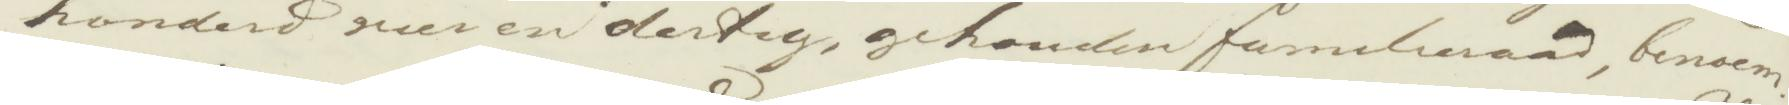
honderd vier en dertig, gehouden familieraad, benoem
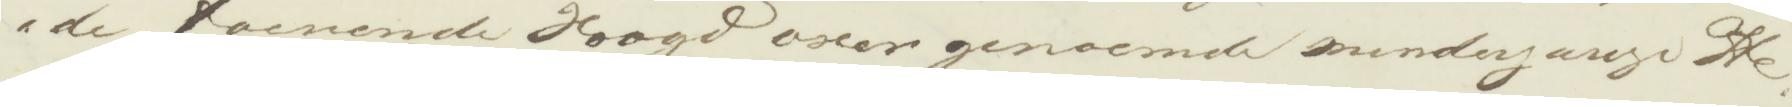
„de toeziende Voogd over genoemde minderjarige He
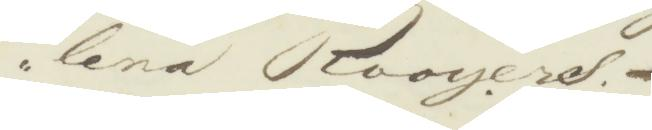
„lena Rooyers.
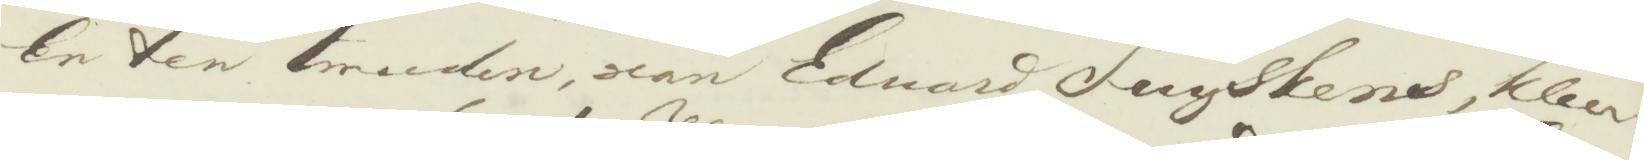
En ten tweeden, van Eduard Suyskens, kleer
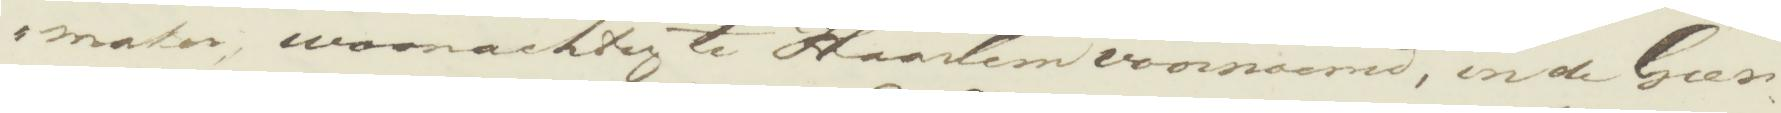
„maker, woonachtig te Haarlem voornoemd, in de Gier
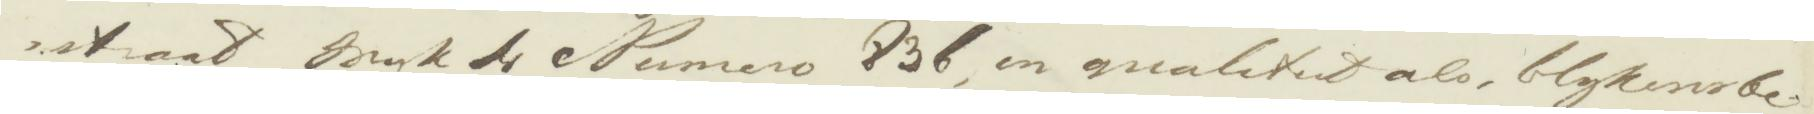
„straat wyk 4 Numero 836, in qualiteit als, blykens be=
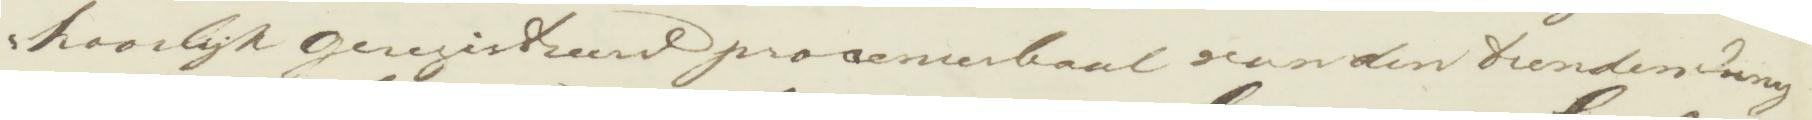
„hoorlyk geregistreerd procesverbaal van den tienden Iuny
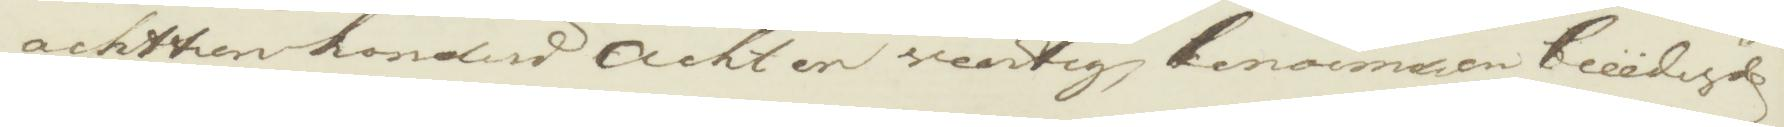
achttien honderd acht en veertig, benoemend en beëedigde
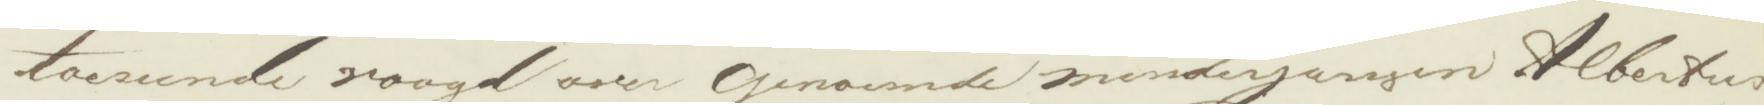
toeziende voogd over genoemde minderjarigen Albertus
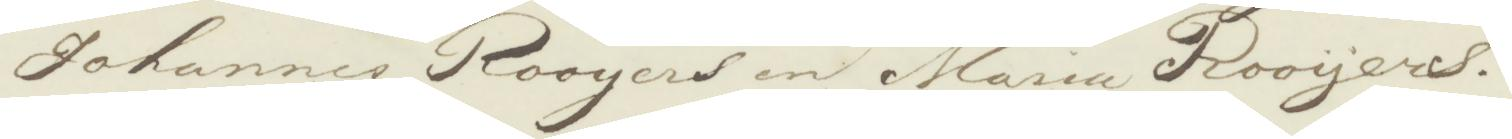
Iohannes Rooyers en Maria Rooyers.
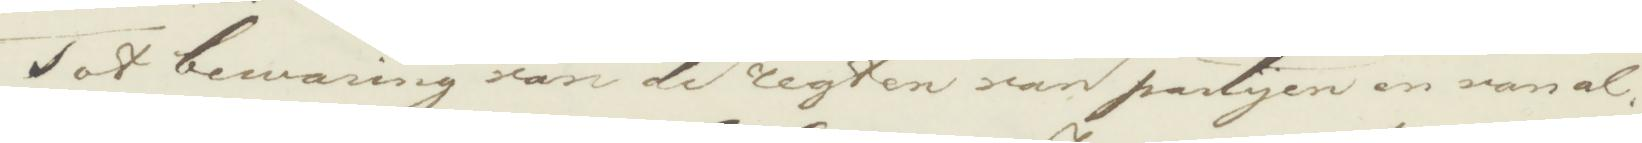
Tot bewaring van de regten van partyen en van al
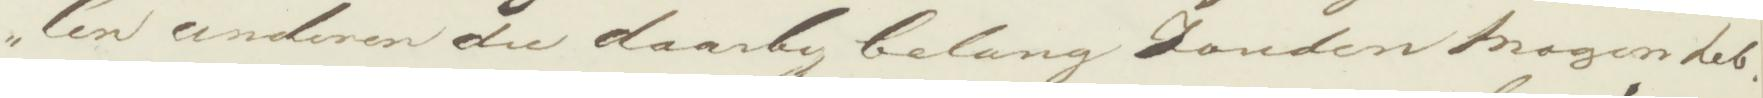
„len anderen die daarby belang zouden mogen heb
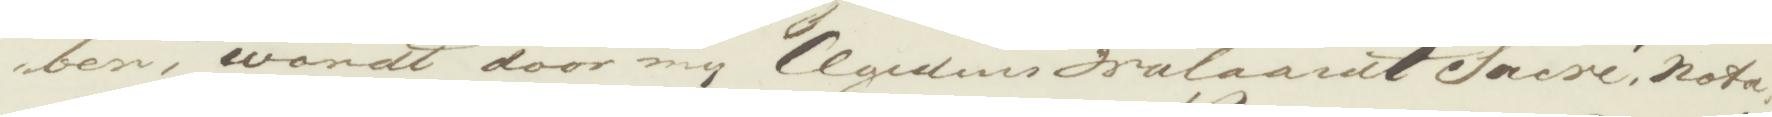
„ben, wordt door my AEgidius Walaardt Sacré, Nota
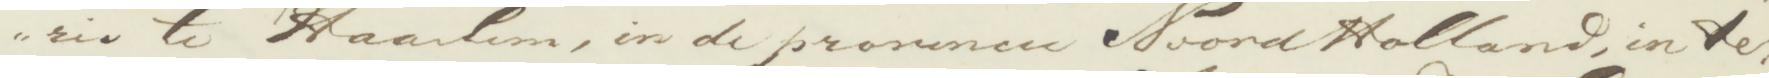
„ris te Haarlem, in de provincie Noord Holland, in te
